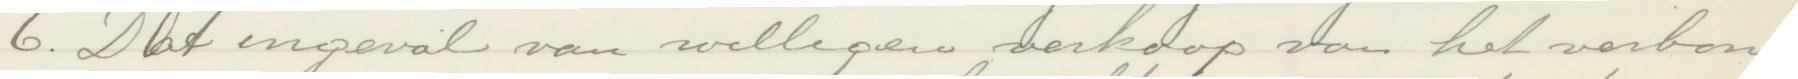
6. Dat ingeval van willigen verkoop van het verbon
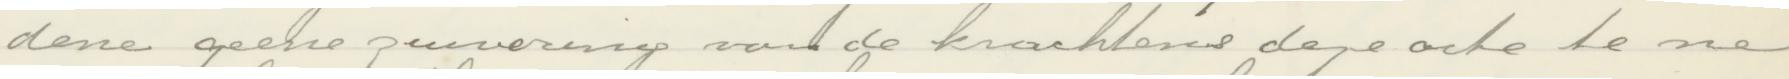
dene geene zuivering van de krachtens deze acte te ne
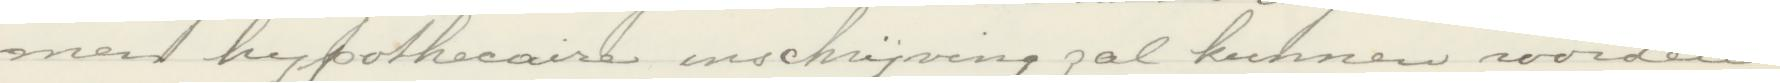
men hypothecaire inschrijving zal kunnen worden
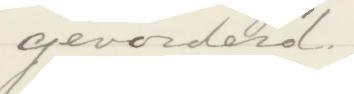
gevorderd.
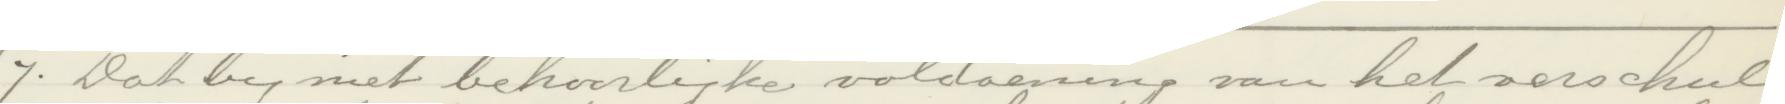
7. Dat by niet behoorlijke voldoening van het verschul
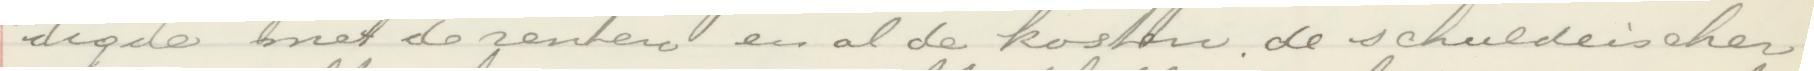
digde met de renten en al de kosten, de schuldeischer
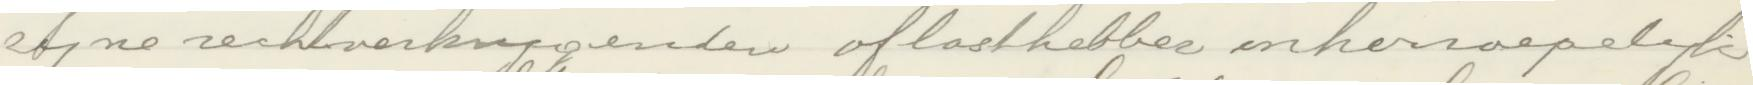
zyne rechtverkrygenden of lasthebber onherroepelyk
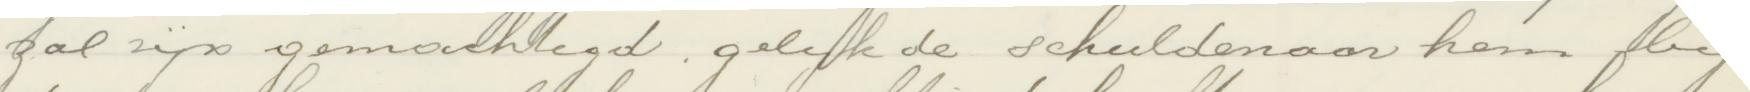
zal zijn gemachtigd, gelyk de schuldenaar hem bij
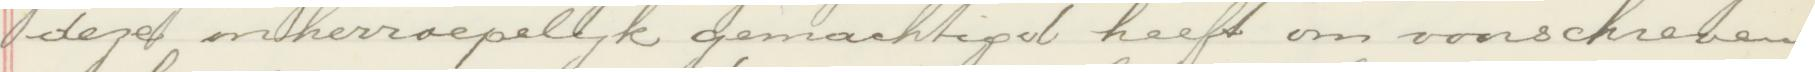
deze onherroepelyk gemachtigd heeft om voorschreven
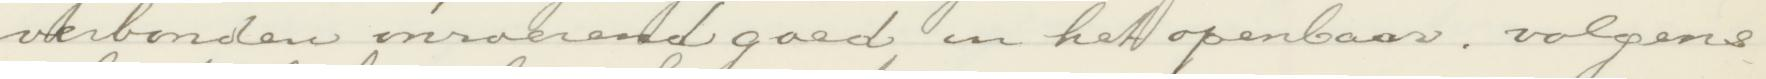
verbonden onroerend goed in het openbaar, volgens
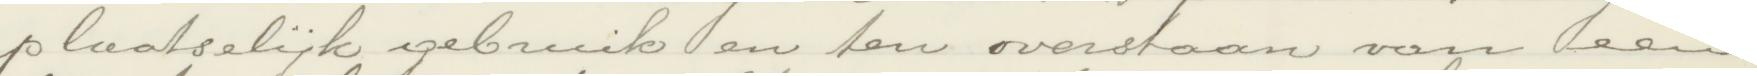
plaatselijk gebruik en ten overstaan van een
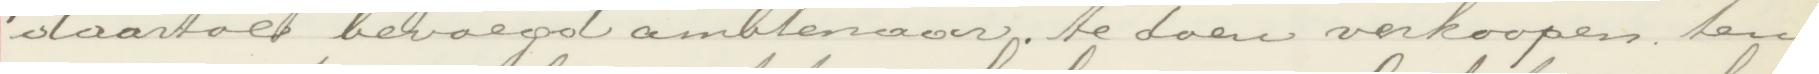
daartoe bevoegd ambtenaar, te doen verkoopen, ten
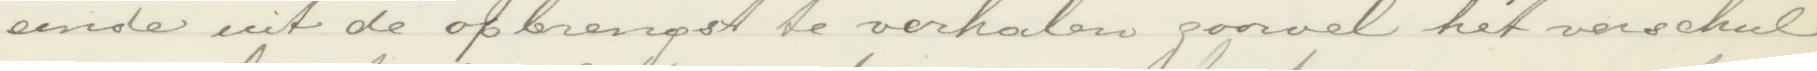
einde uit de opbrengst te verhalen zoovel het verschul
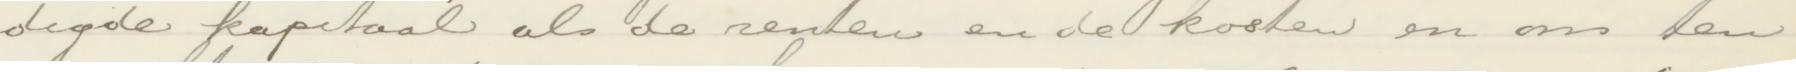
digde kapitaal als de renten en de kosten en ons ten
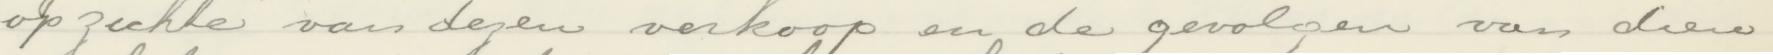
op zichte van dezen verkoop en de gevolgen van dien
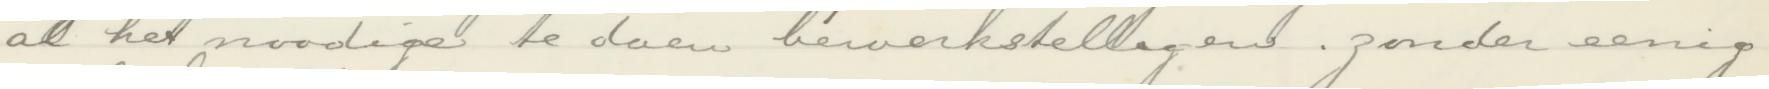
al het noodige te doen bewerkstelligen, zonder eenig
